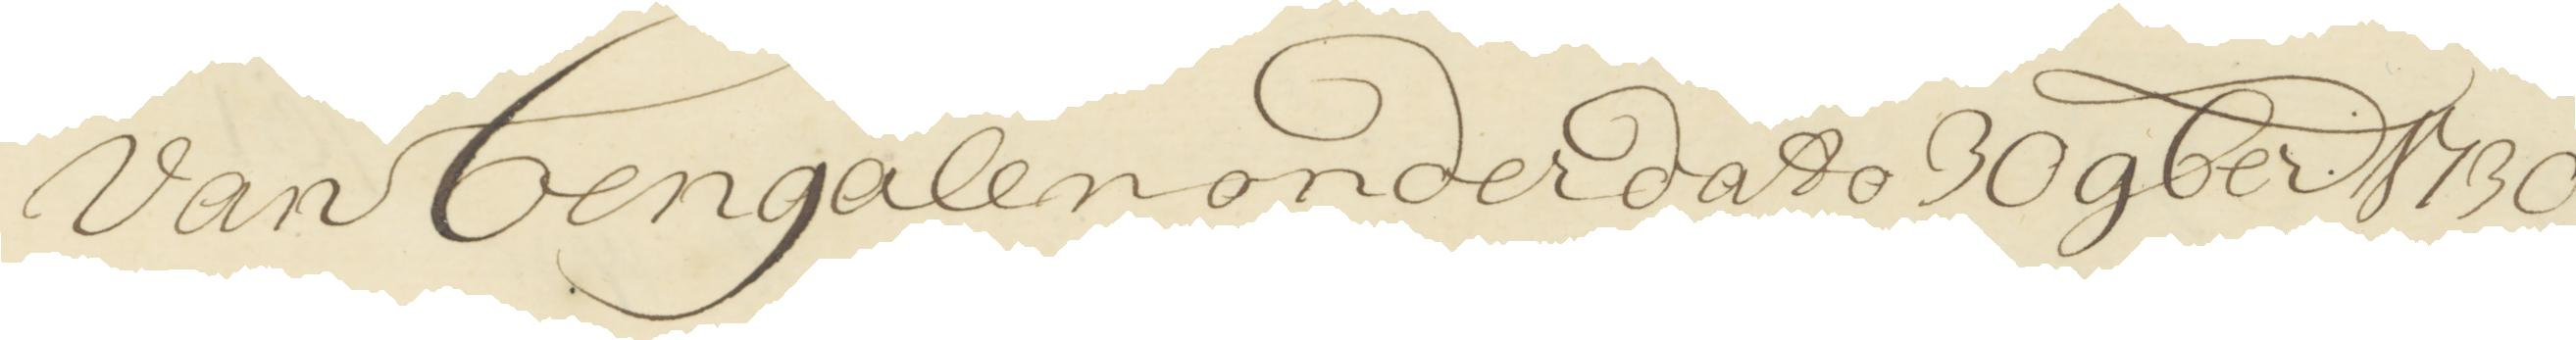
Van Bengalen onder dato 30 9ber: 1730
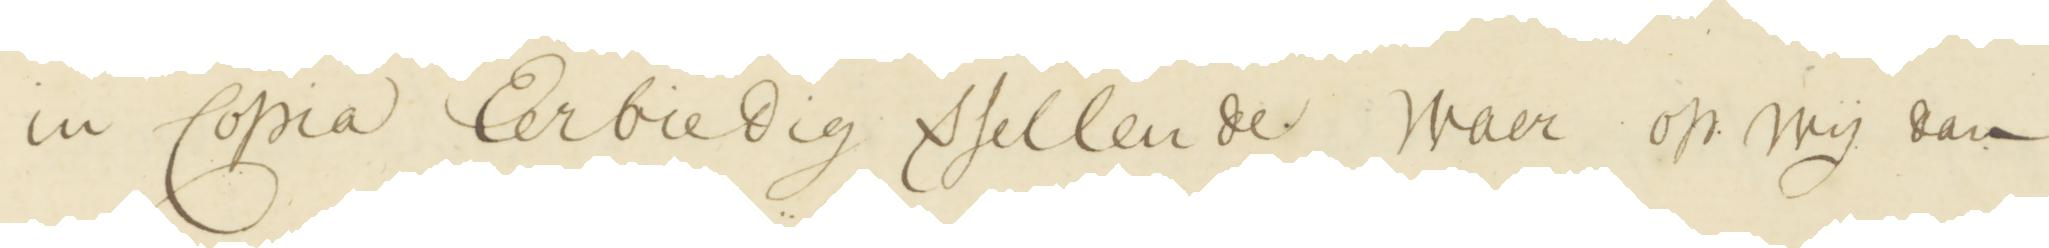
in Copia Eerbiedig versellende waer op wij dan
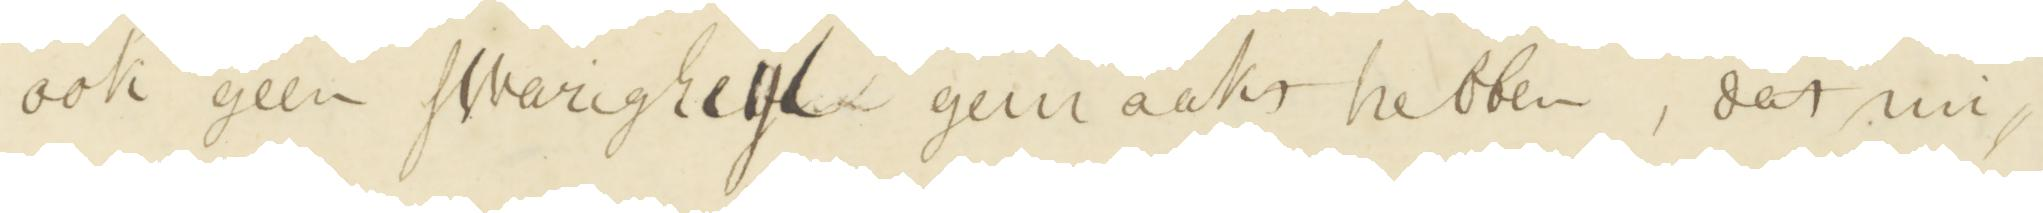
ook geen swarigheijt gemaakt hebben, dat mi„
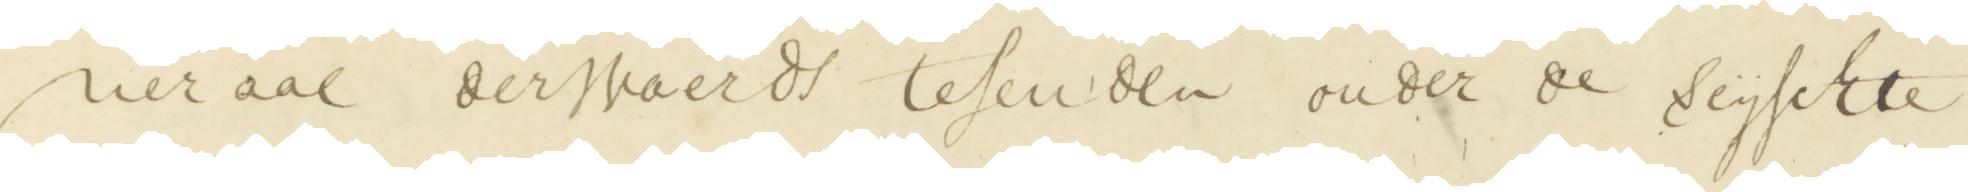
neraal derwaerds te senden onder de vereijschte
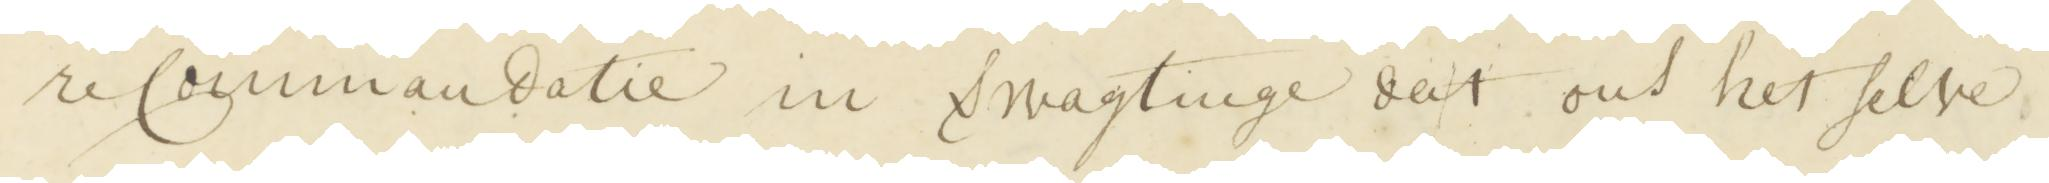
recommandatie in verwagtinge dat ons het selve
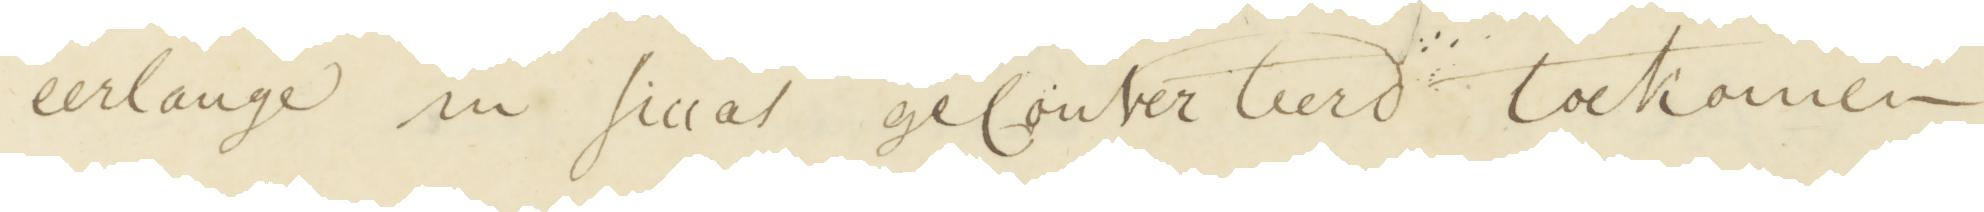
eerlange in siccas geconverteerd toekomen
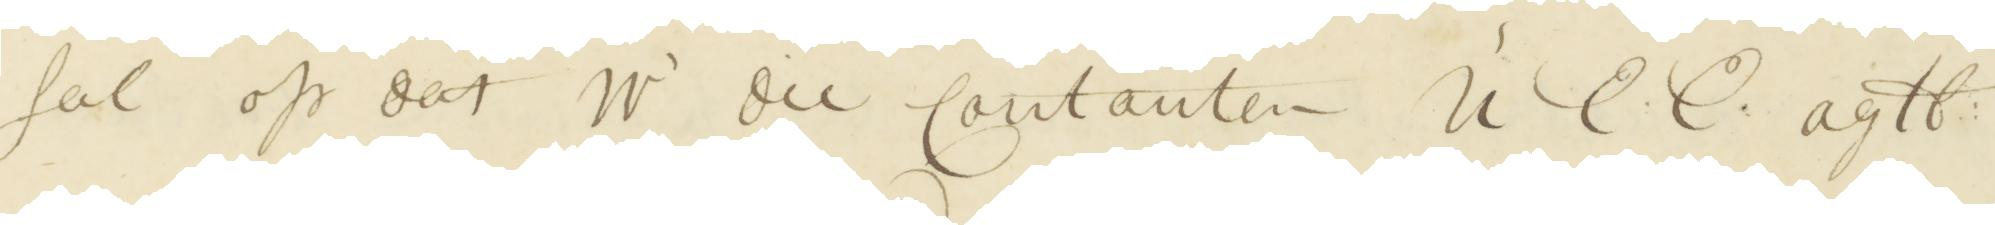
sal op dat w' die contanten U E' E' agtb:
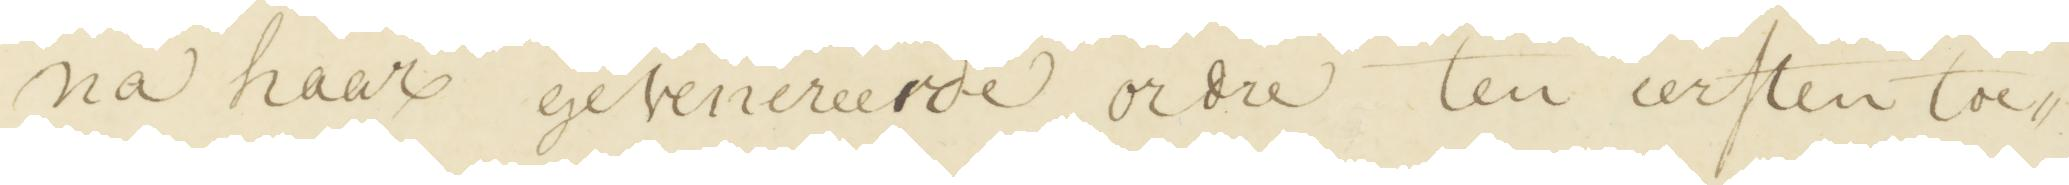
na haar gevenereerde ordre ten eersten toe„
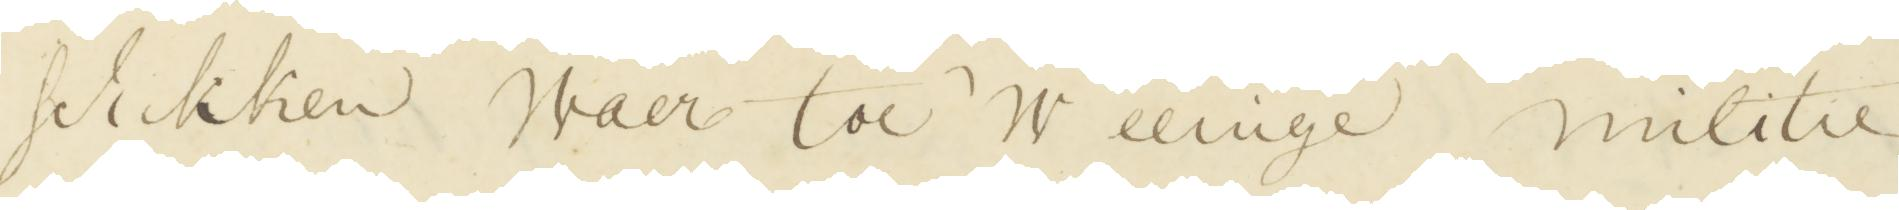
schikken waer toe 'w eenige militie
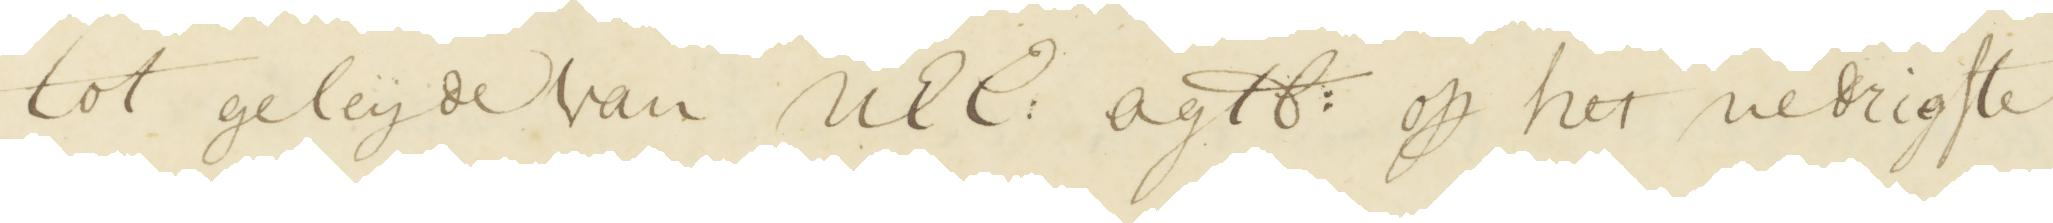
tot geleijde van UEE: agtb: op het nedrigste
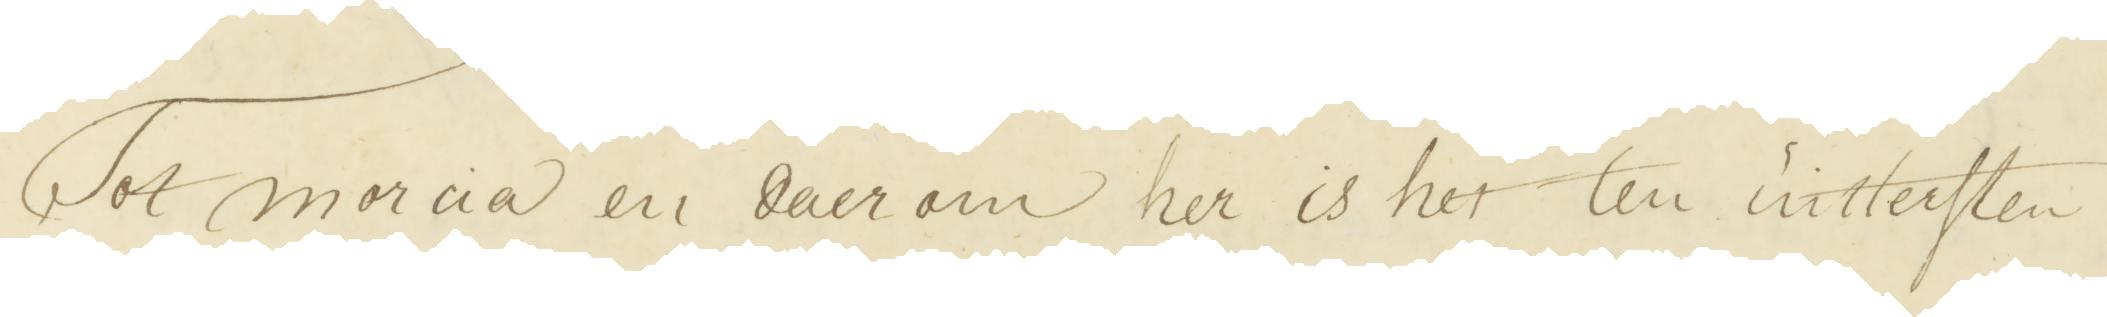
Tot morcia en daer om her is het ten uittersten
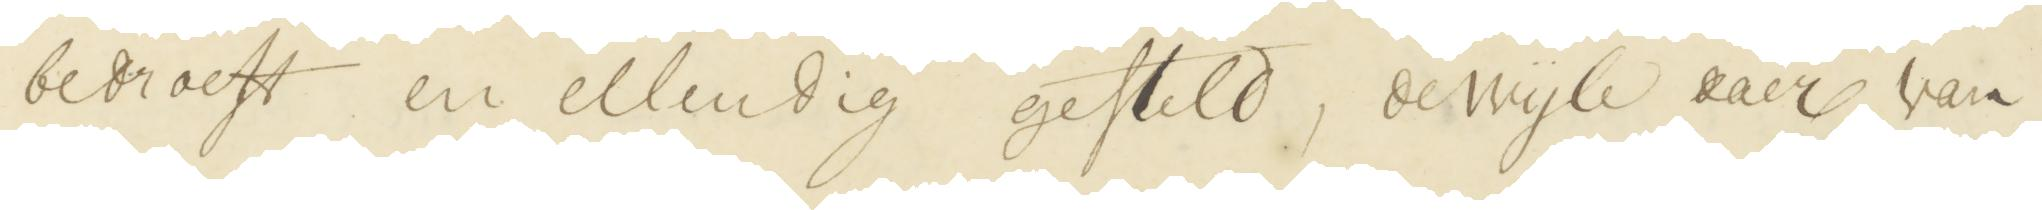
bedroeft en ellendig gesteld, dewijle daer van
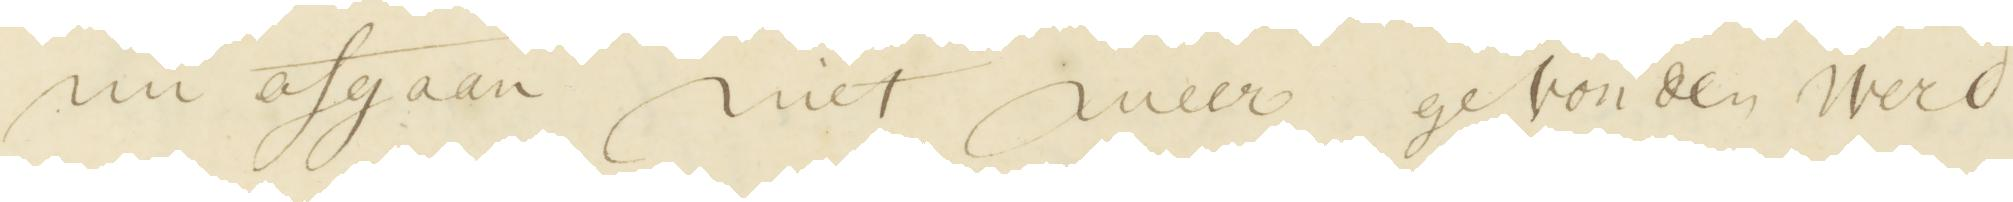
nu afgaan niet meer gevonden werd
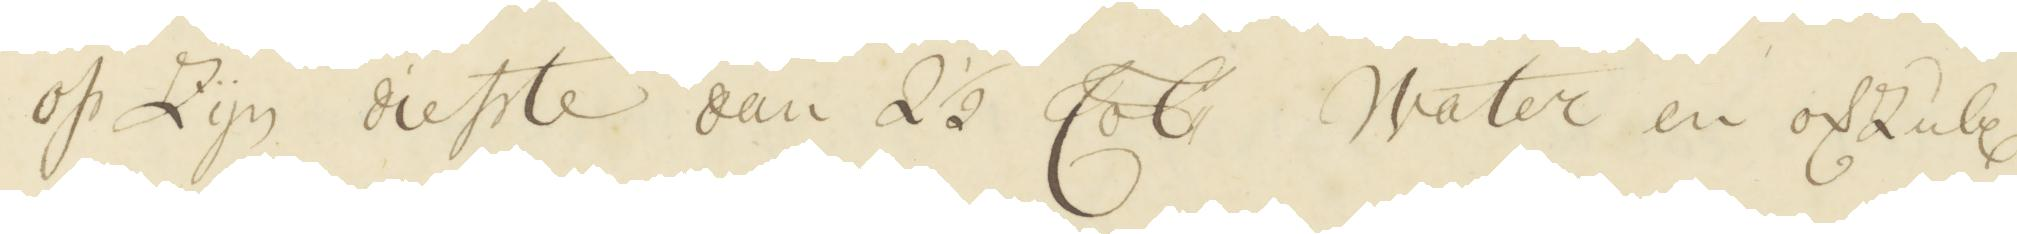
op zijn diepte dan 2½ Cob„s water en overzulx
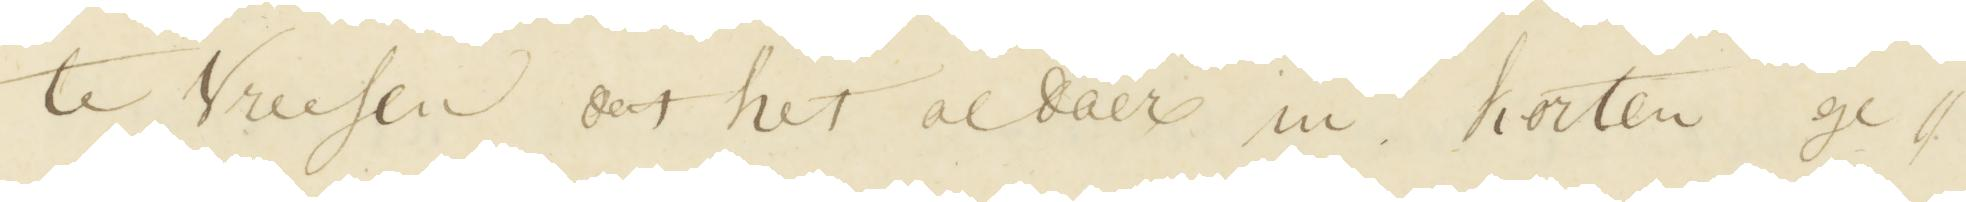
te vreesen dat het aldaer in korten ge„
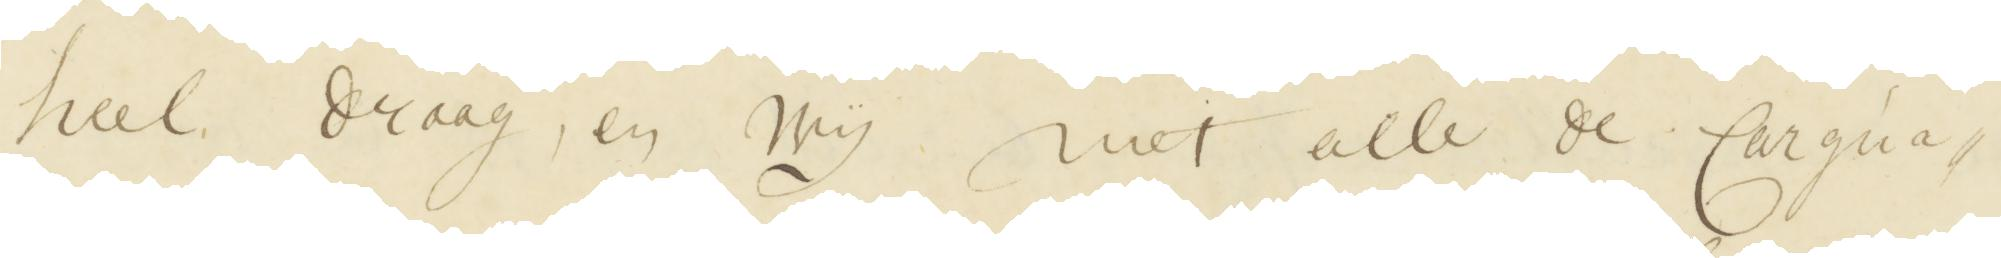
heel draag, en wij met alle de Cargua„
